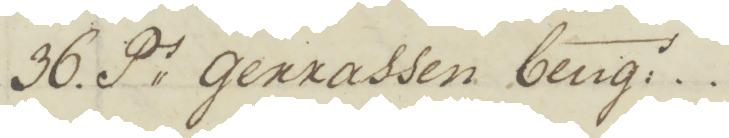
36. P„s gerrassen beng:s . .
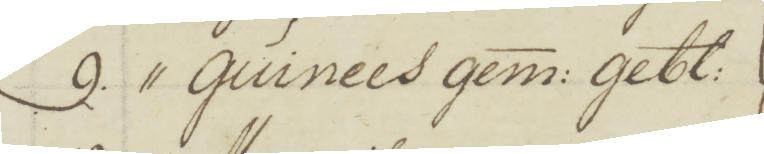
9. „ guinees gem: gebl:
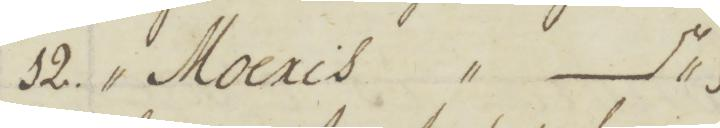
12. „ Moeris „ _„o
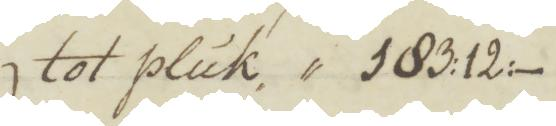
tot pluk, „ 183:12:–
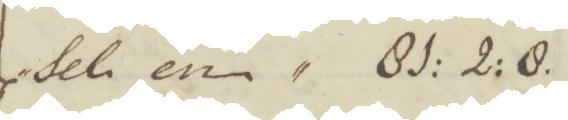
„sel en „ 81: 2: 8.
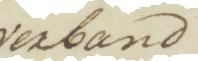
verband
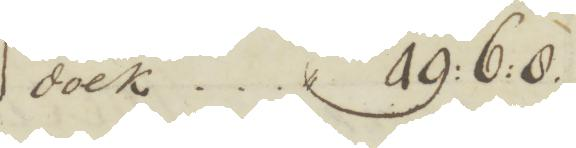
doek . . . „ 49: 6: 8.
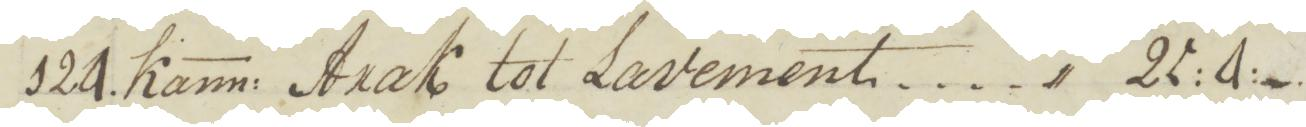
124. kann: Arak tot Lavement . . . . .„ 25: 4:–
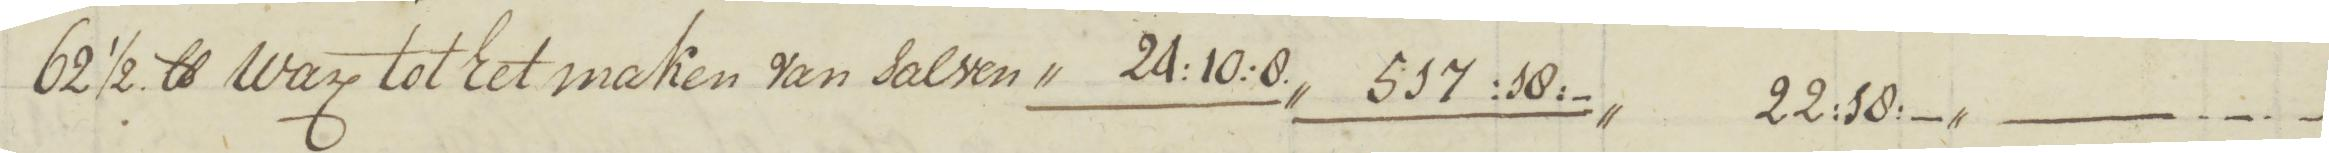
62½. lb wax tot het maken van salven „ 24:10:8.„ 517 :18:– „ 22:18:–„ — . – . –
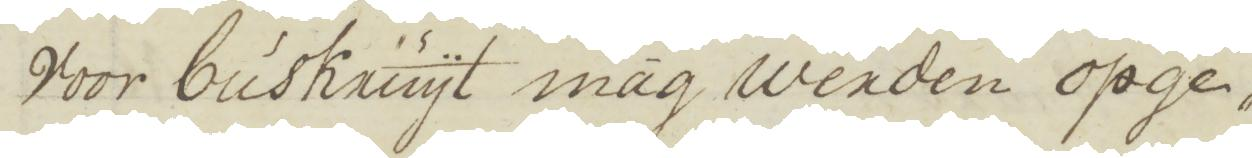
voor buskruijt mag werden opge
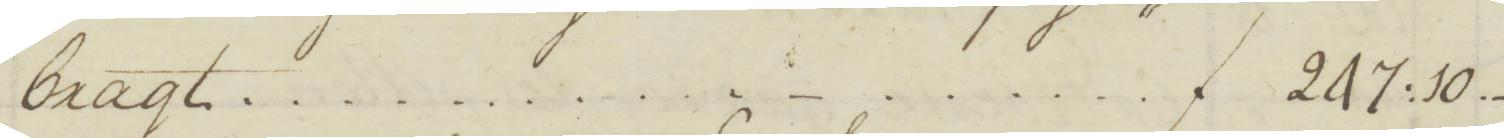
bragt . . . . . . . . . . - – . . . . . . ƒ 247:10.
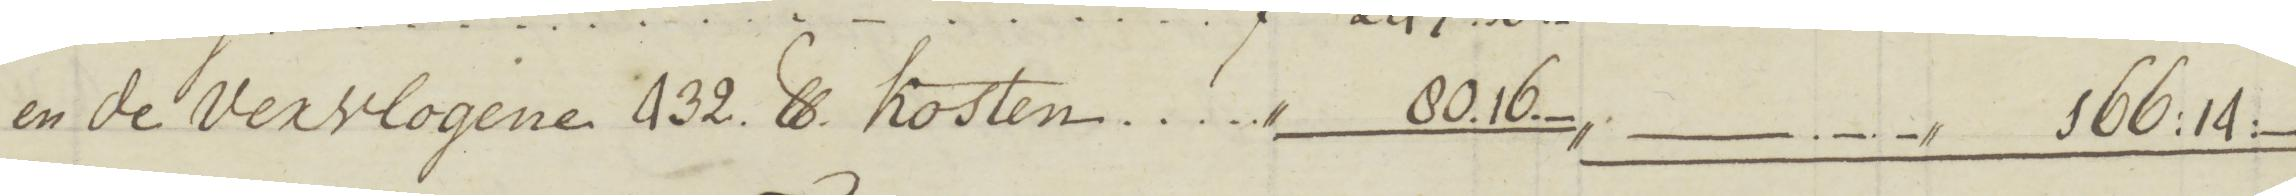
en de vervlogene 432. lb. kosten . . . . . „ 80.16.– „ —. –. –„ 166:14:–
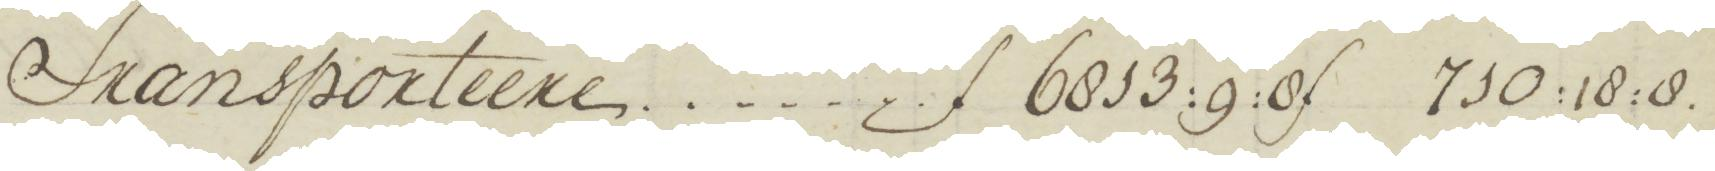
Transporteere . . - - - . . ƒ 6813:9:8ƒ 710:18:8.
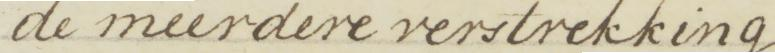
de meerdere verstrekking
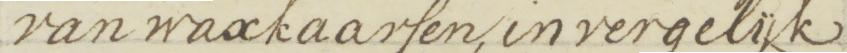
van waxkaarsen, in vergelijk
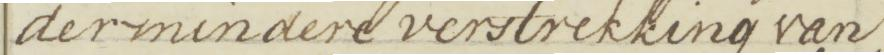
der mindere verstrekking van
